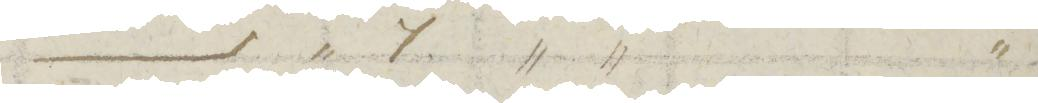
— „ 7. „ „ „
